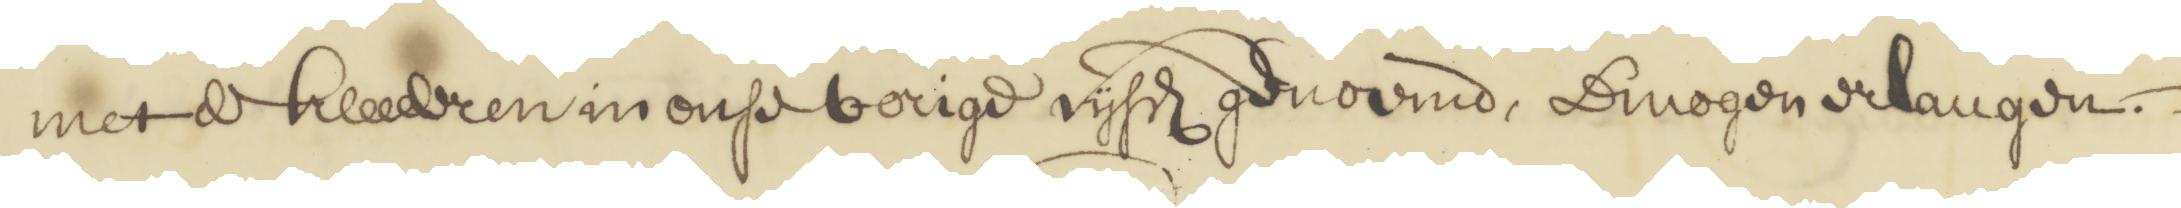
met de kleederen in onse vorige Eijsch genoemd, temogen erlangen.
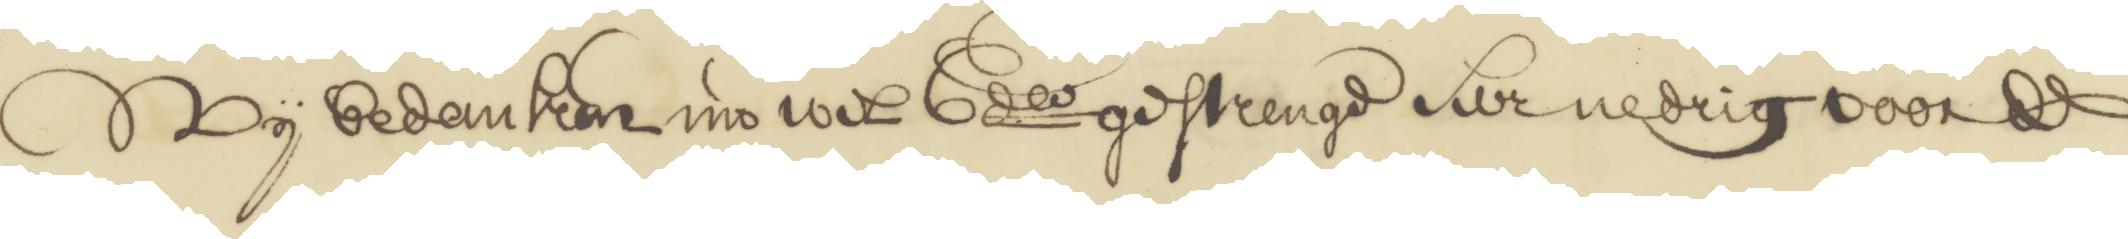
Wij bedanken uw wel Ed=le gestrenge seer nedrig voor de
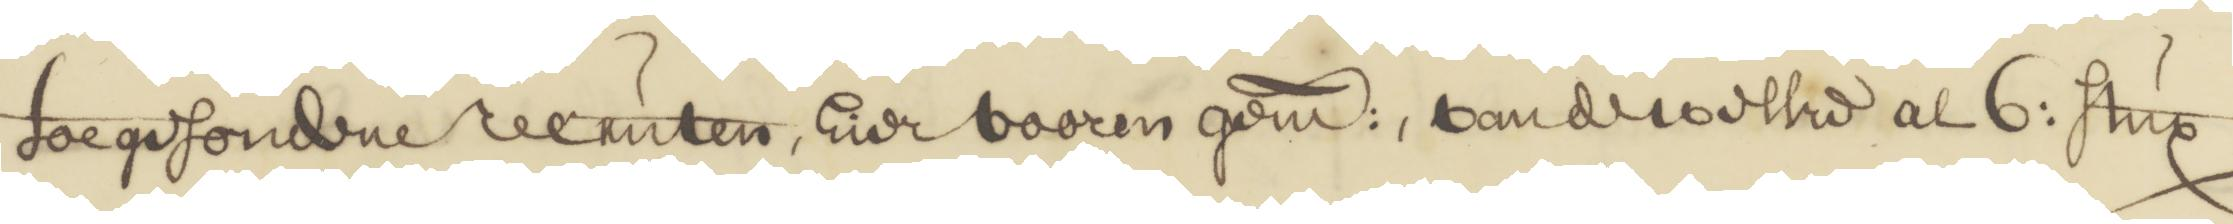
toegesondene recruten, hier vooren gem:, van de welke al 6: stux
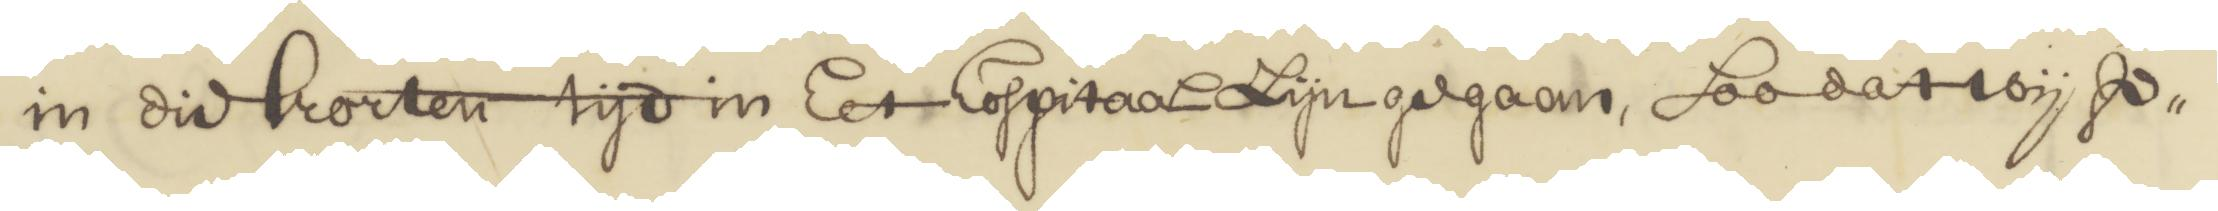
in die korten tijd in het hospitaal zijn gegaan, soo dat wij te„
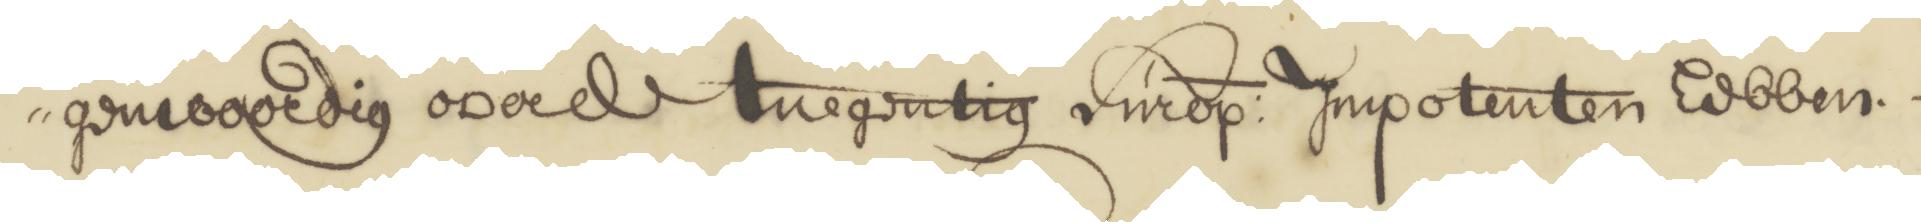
„genwoordig over de tnegentig Europ: Jmpotenten hebben.
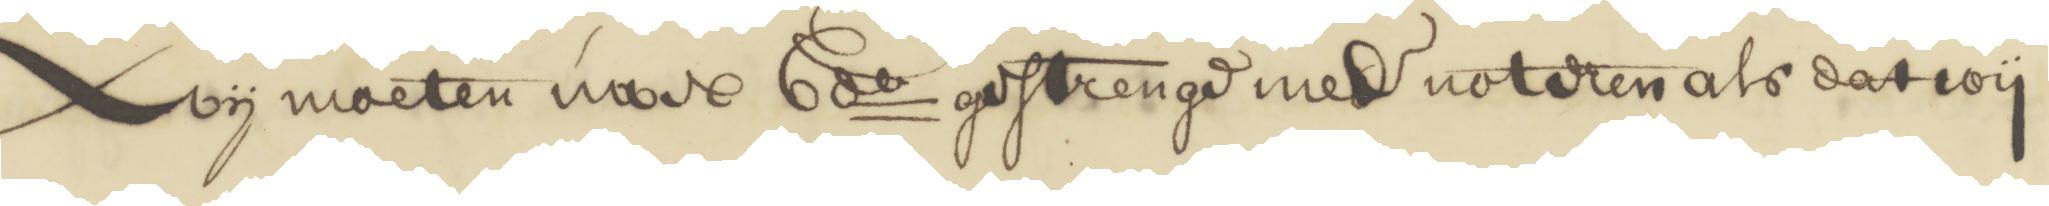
Wij moeten uwel Ed=e gestrenge mede noteren als dat wij
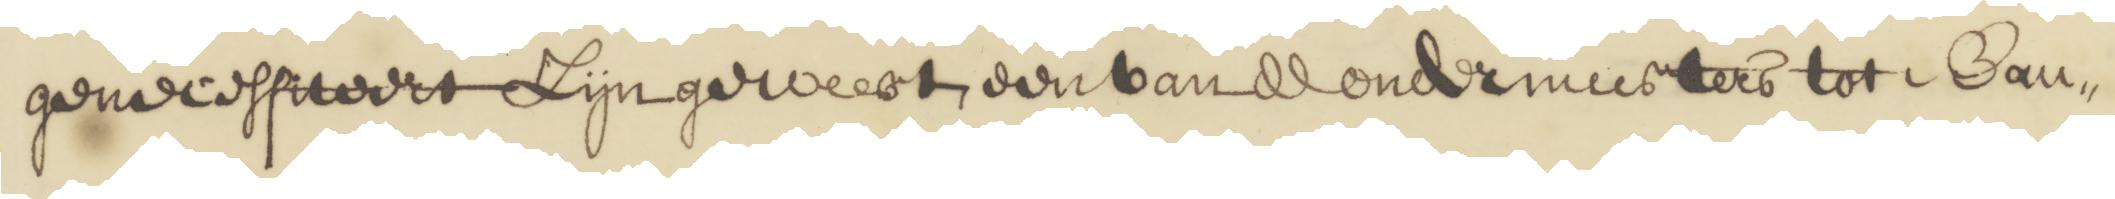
genecessiteert zijn geweest, een van de ondermeesters tot Ban„
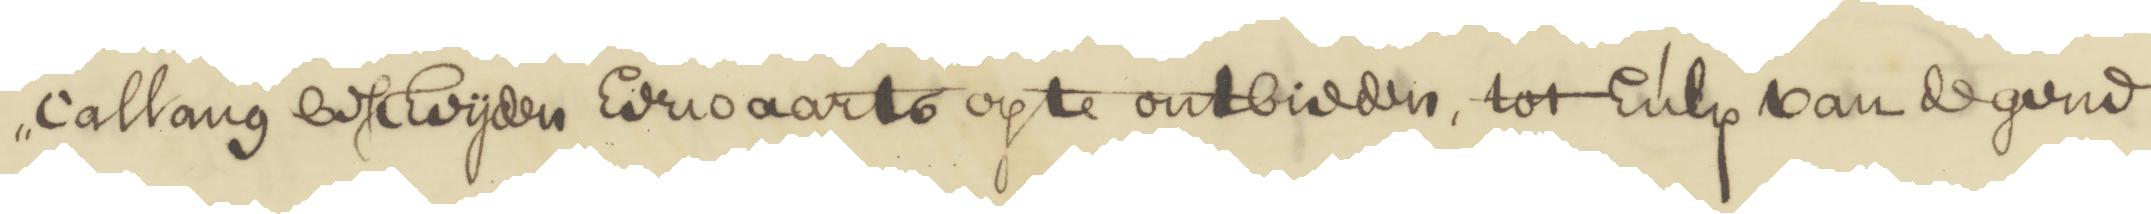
„callang bescheijden herwaarts op te ontbieden, tot hulp van de gene
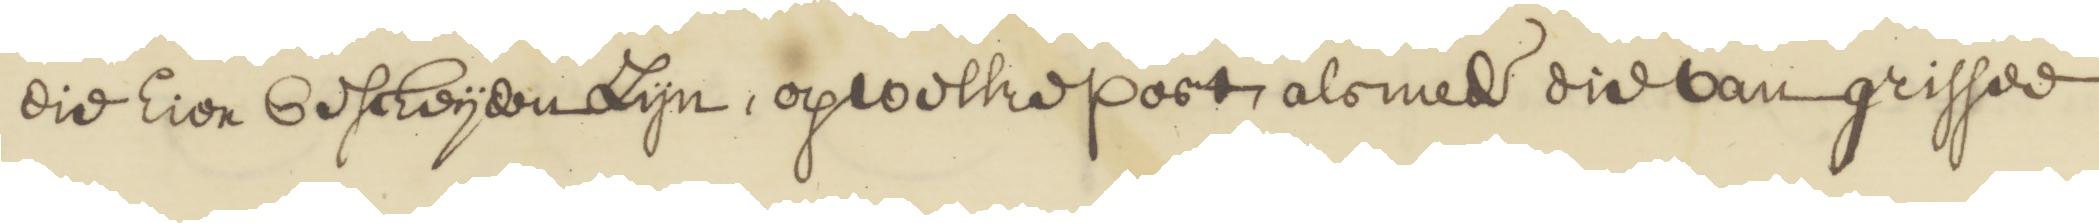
die hier bescheijden zijn, op welke post, als mede die van grissee
